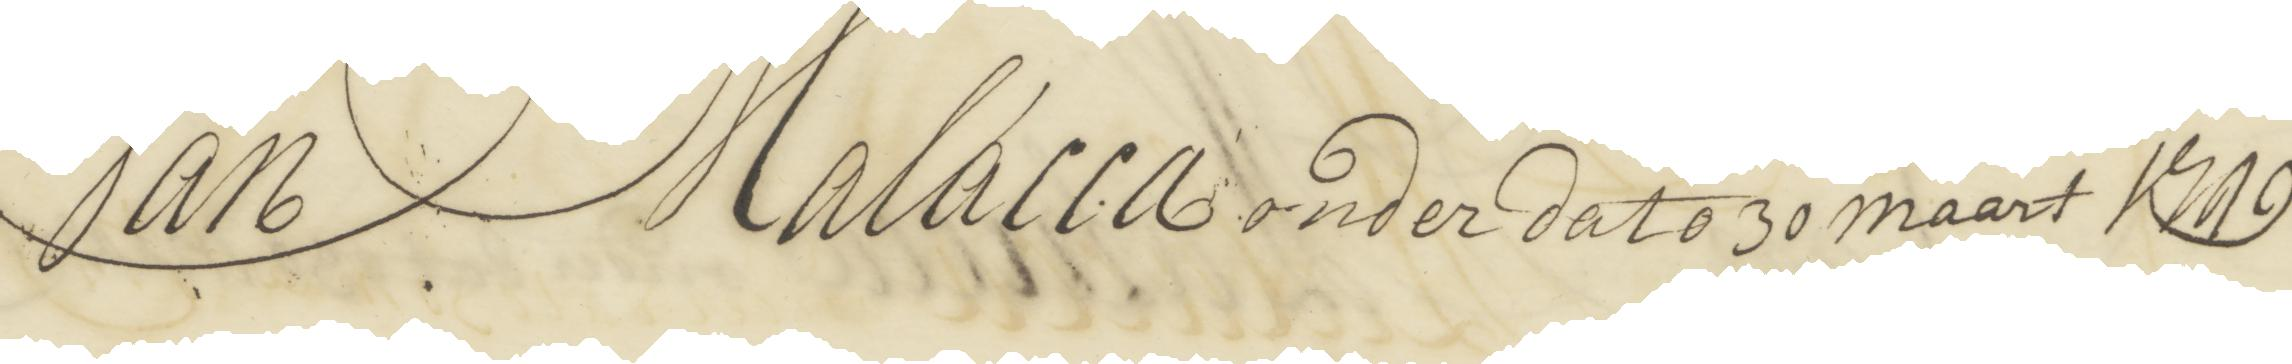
Van Malacca onder dato 30 maart 1749
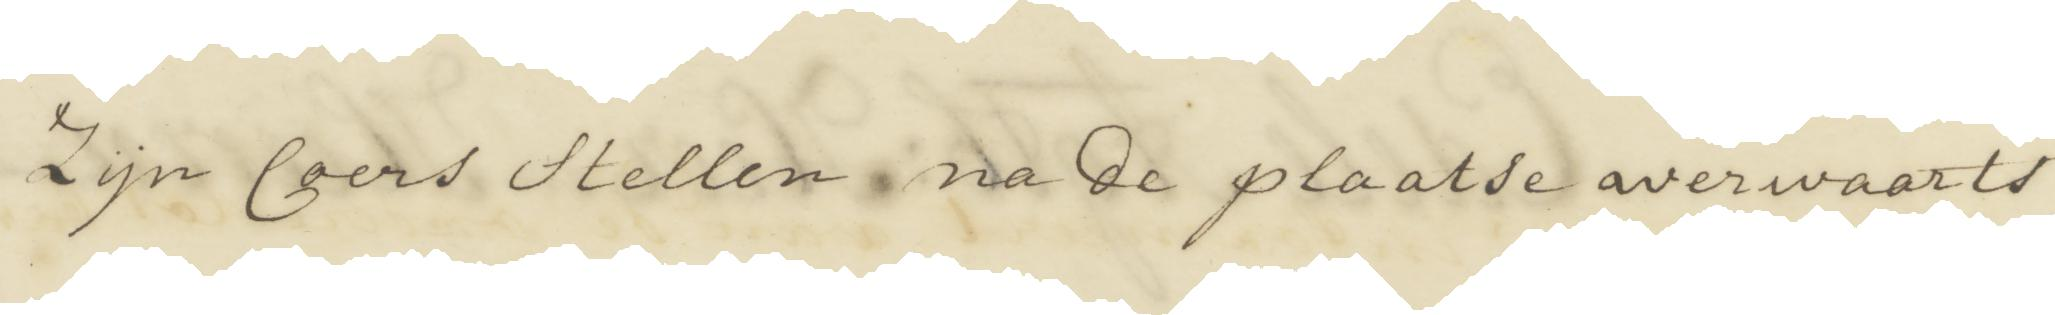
zijn coers stellen, na de plaatse werwaarts
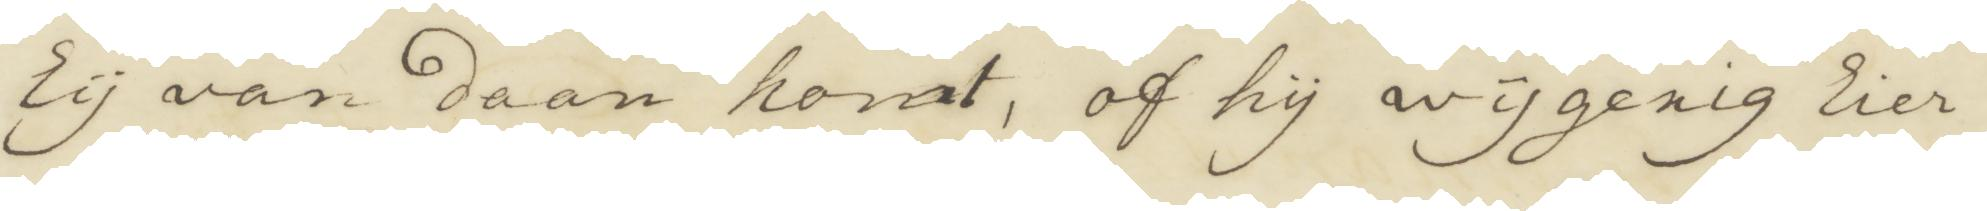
hij van daan komt, of hij wijgerig hier
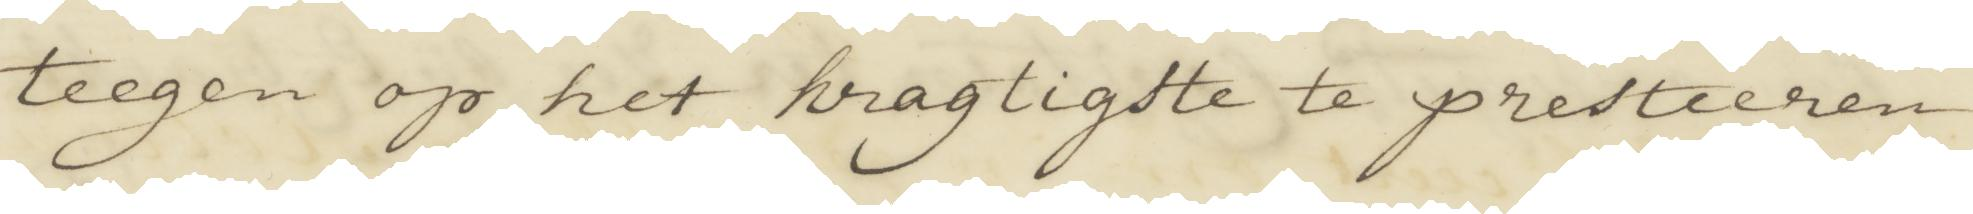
teegen op het kragtigste te presteeren
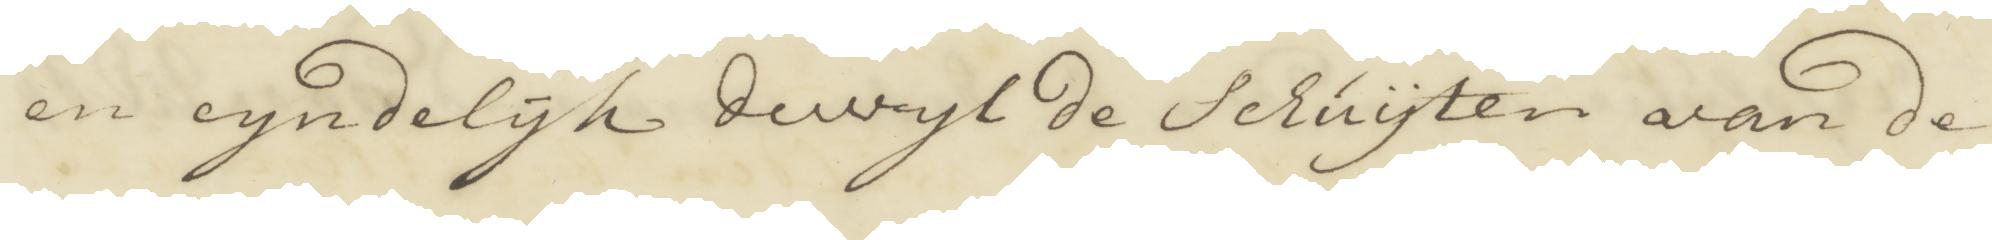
en eyndelijk dewyl de schuijten van de
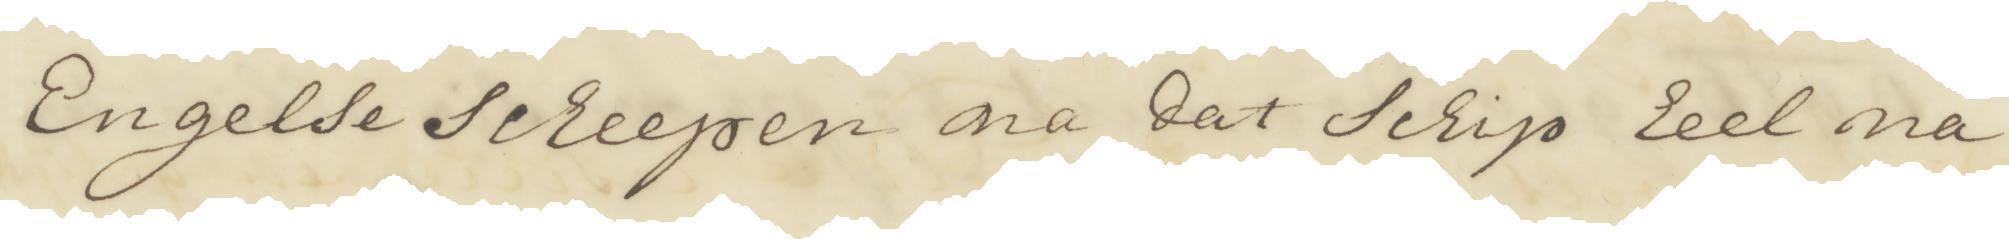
Engelse scheepen na dat schip heel na
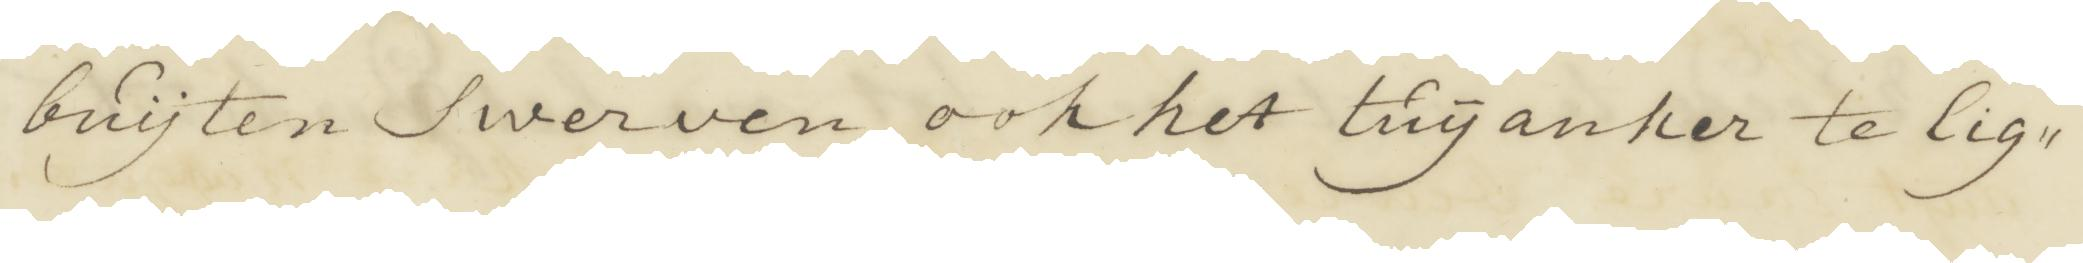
buijten swerven ook het tuij anker te lig„
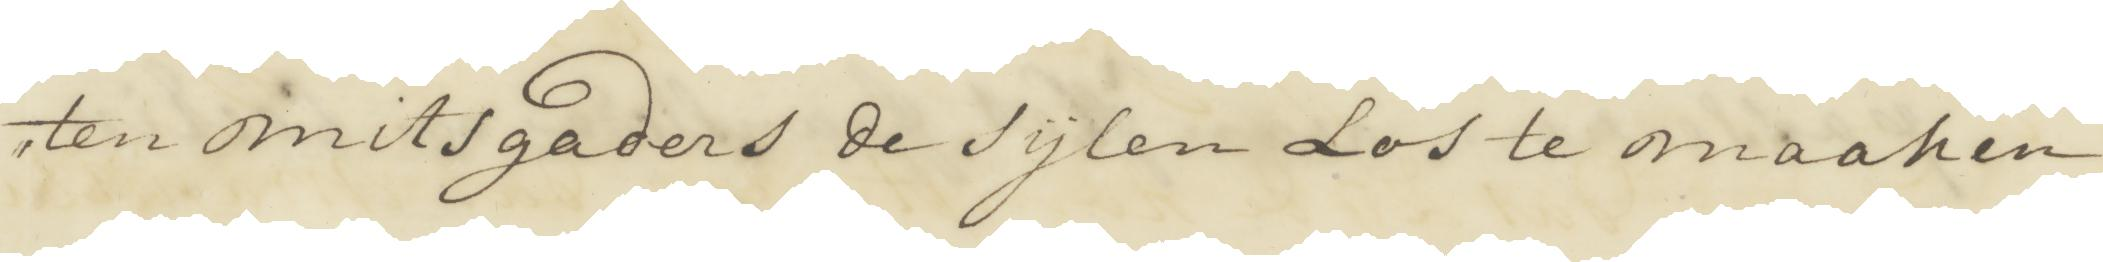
„ten mitsgaders de sijlen los te maaken
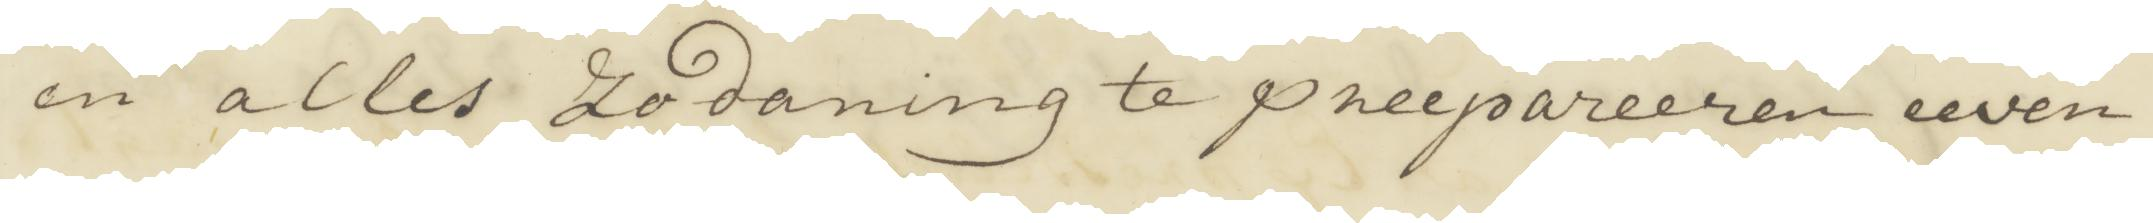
en alles zodaning te preepareeren eeven
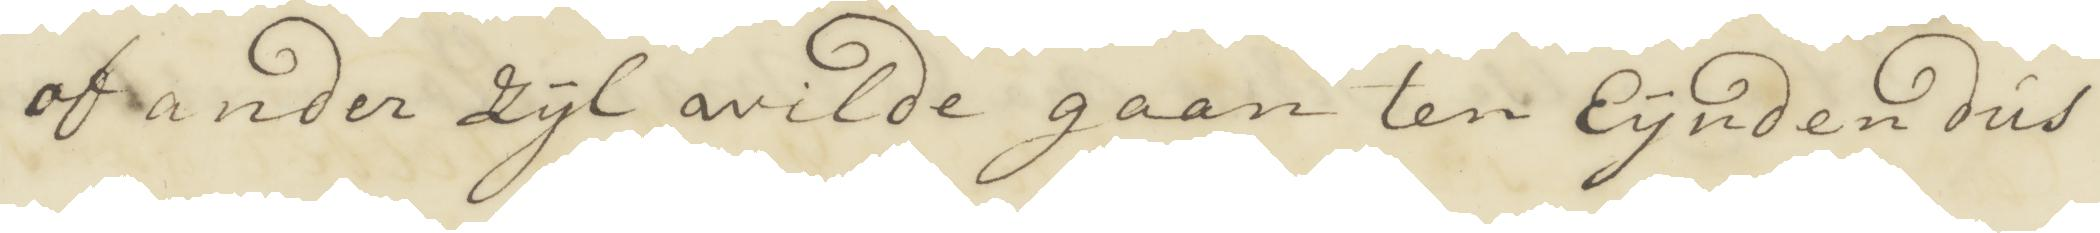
of ander zijl wilde gaan ten Eijnden dus
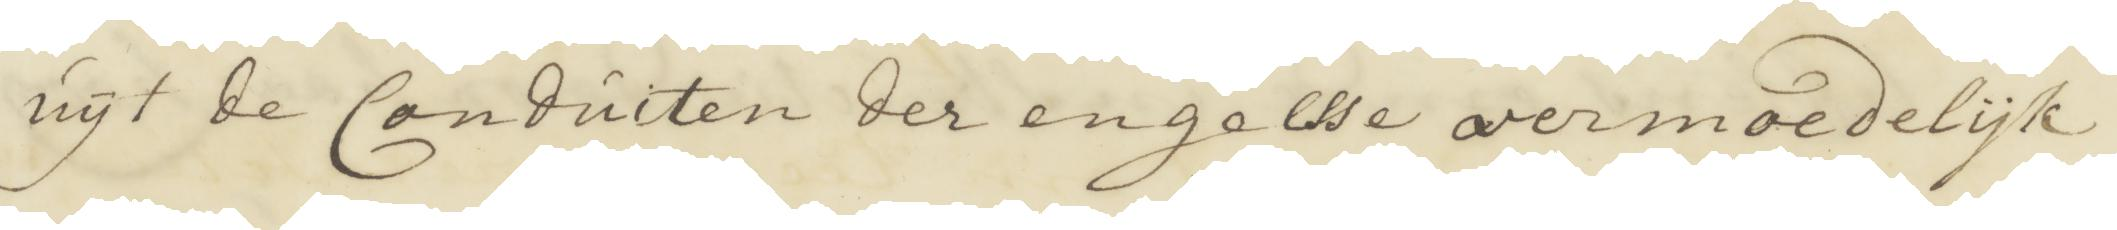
uijt de conduiten der engelse vermoedelijk
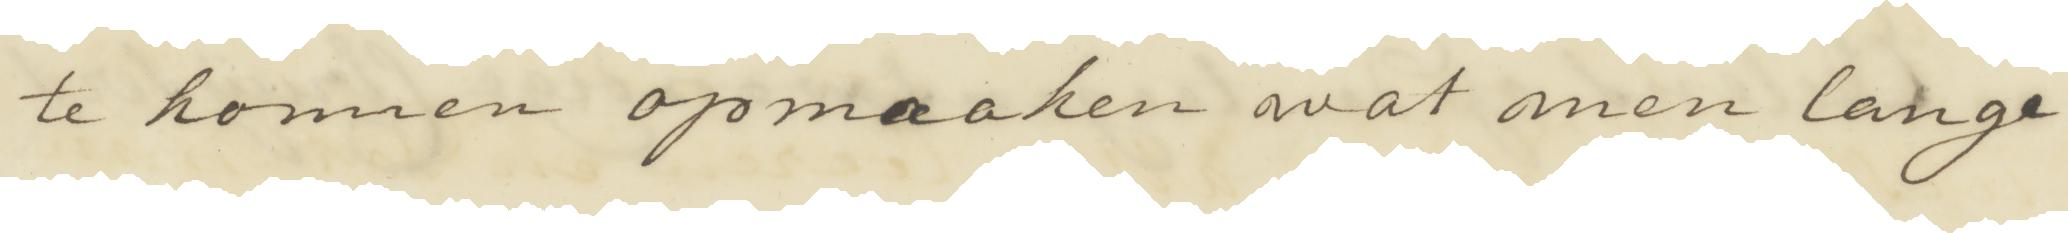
te konnen opmaaken wat men lange
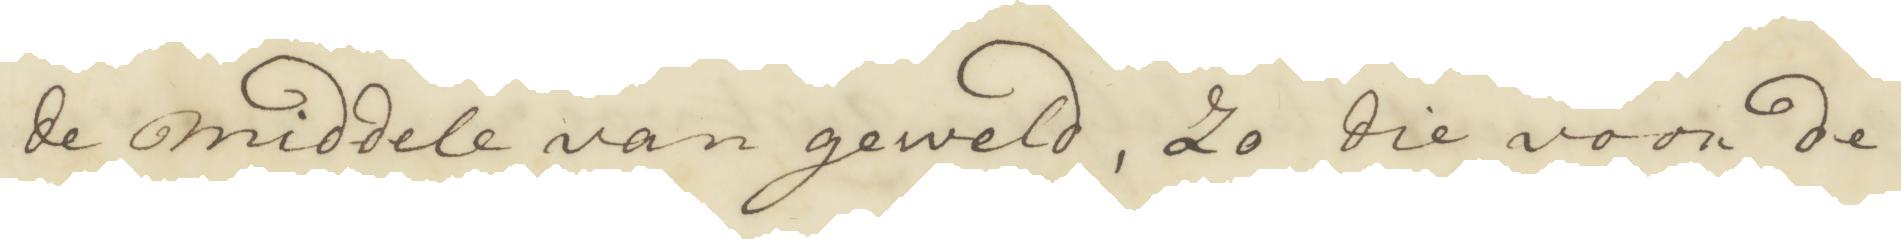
de middele van geweld, zo die voor de
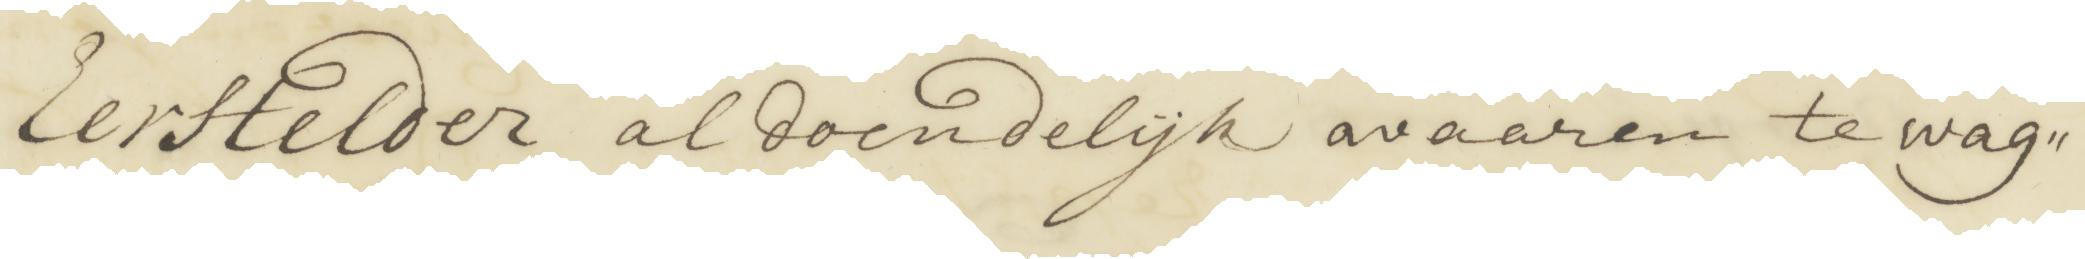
herstelder al doendelijk waaren te wag„
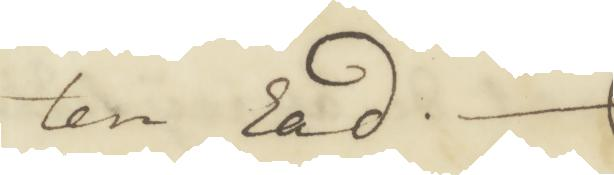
ten had.
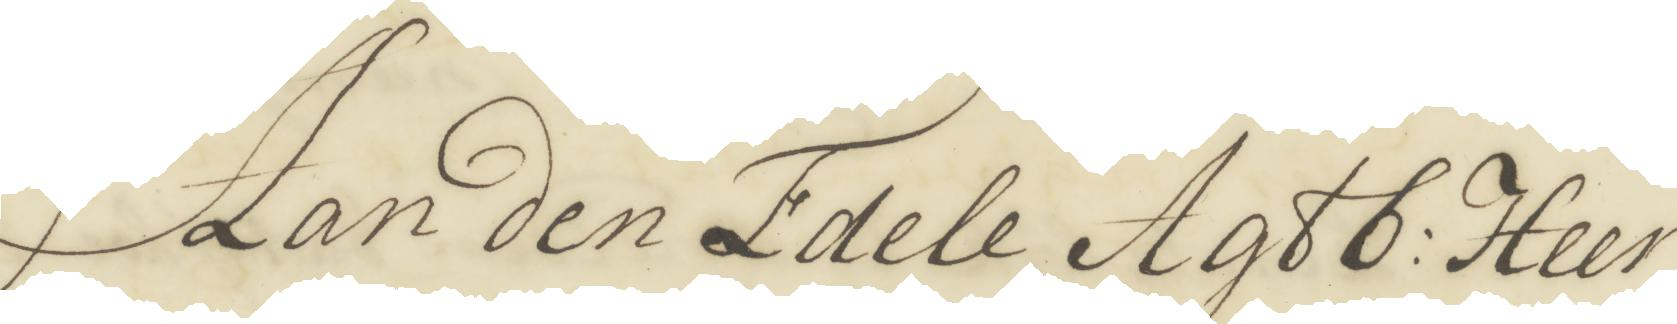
Aan den Edele Agtb: Heer
